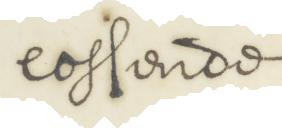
lossende
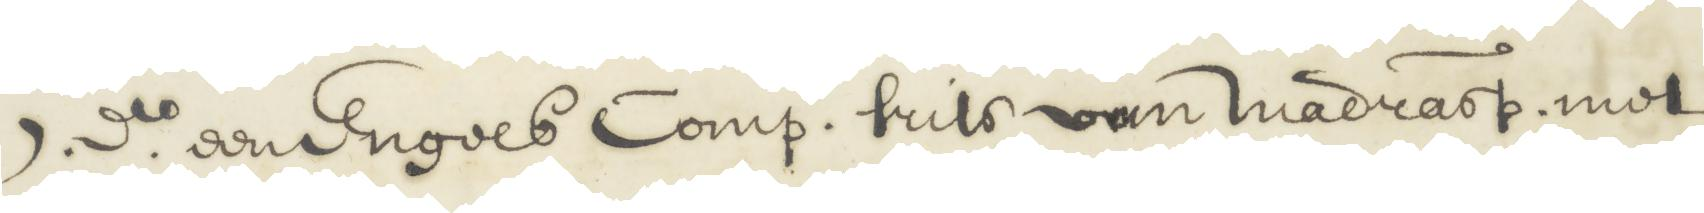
7. d.to een Engels Comp.s kits van madrasp. met
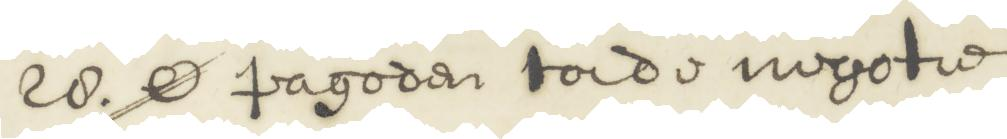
28. Ø pagoden tot de negotie
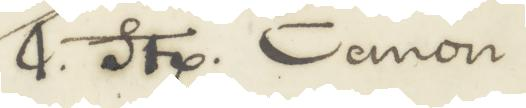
4. stx. Canon
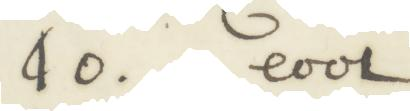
40. „ loot
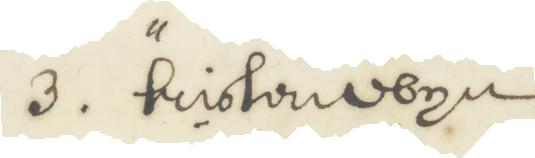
3. kisten wijn
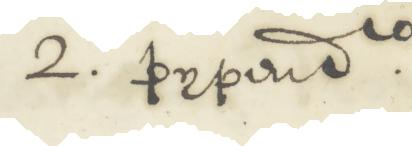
2. pijpen d.to
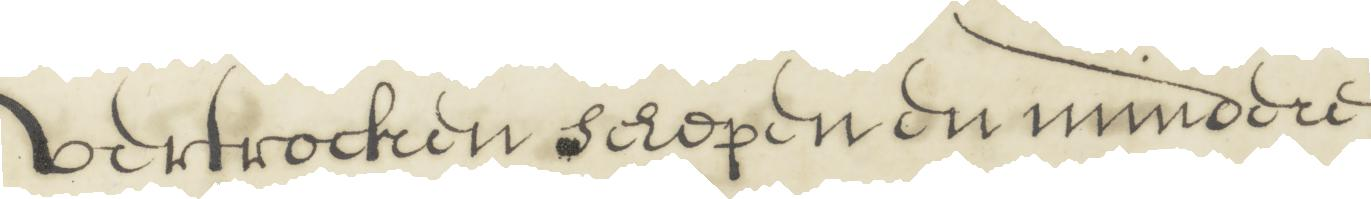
Vertrocken schepen en mindere
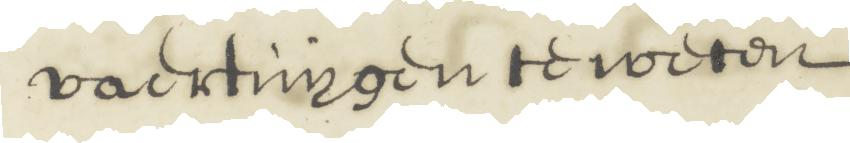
vaertuijgen te weten
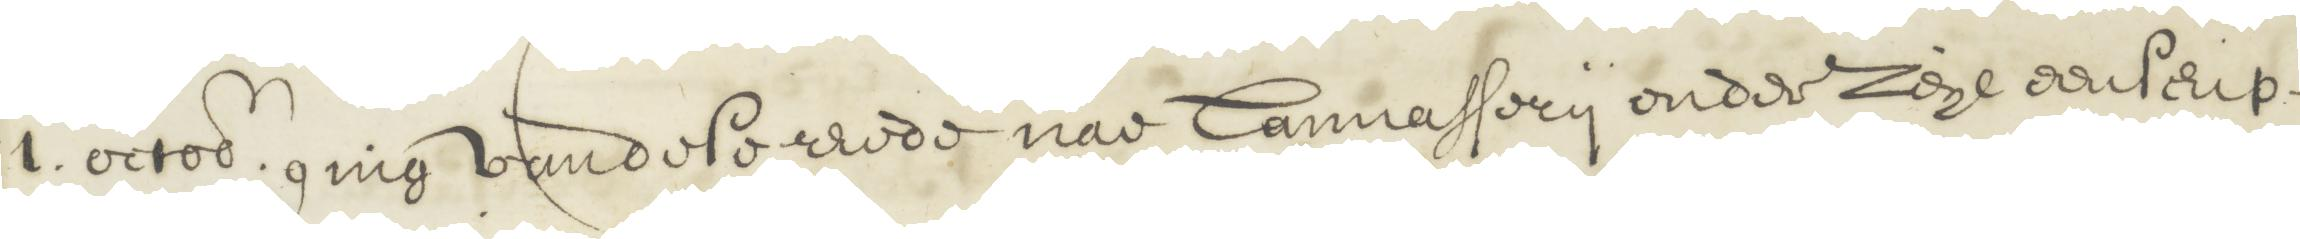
1. octob. ging van dese rhede nae Tannasserij onder zeijl een schip
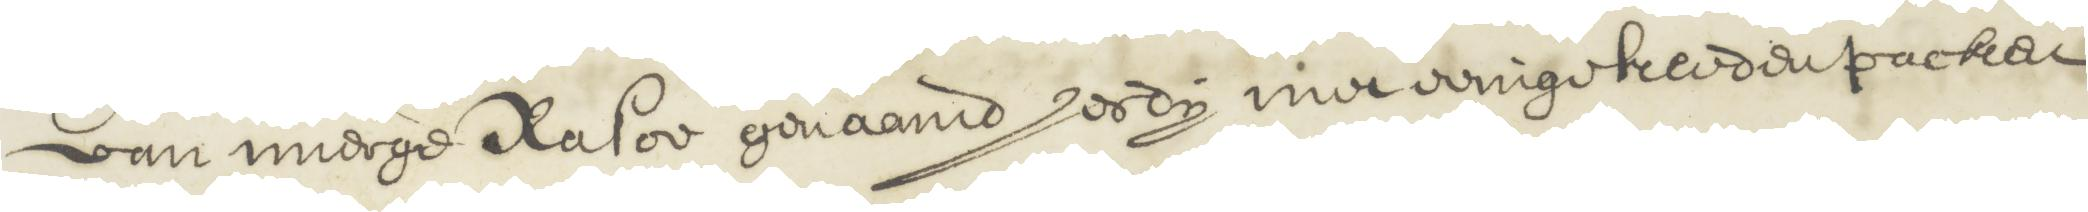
van mierge Xasoe genaamd jesdij met eenige kleden packen
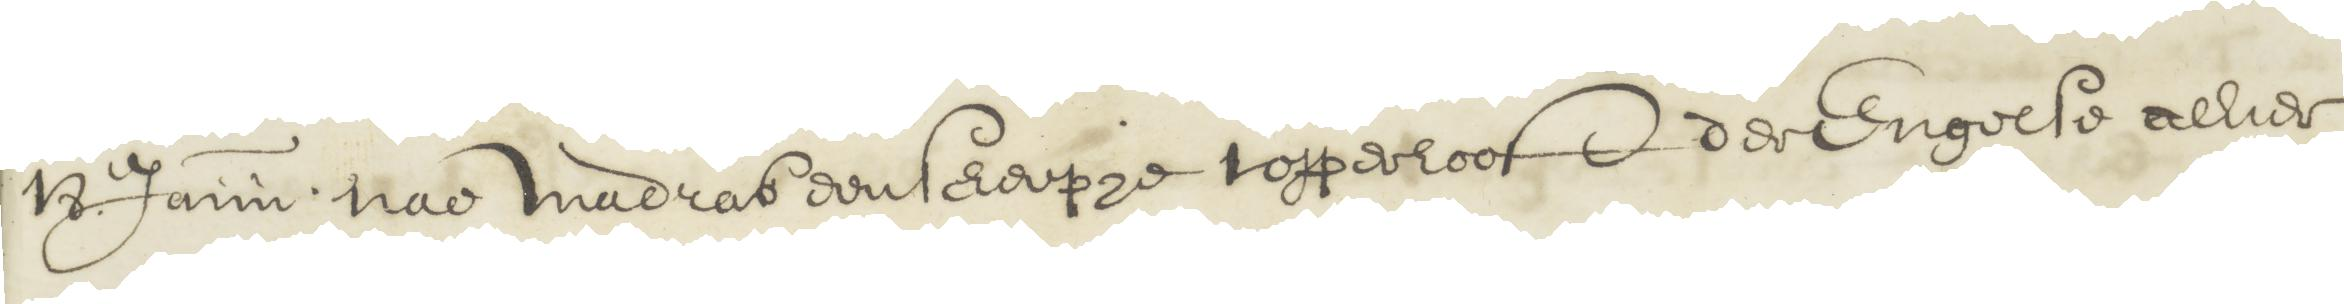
18. Janu. nae madras een scheepje 't opperhooft der Engelse alhier
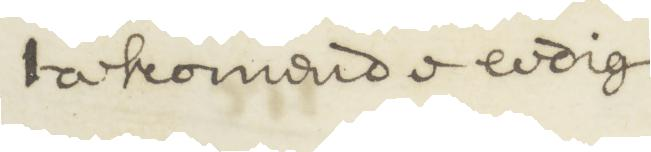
toekomende ledig
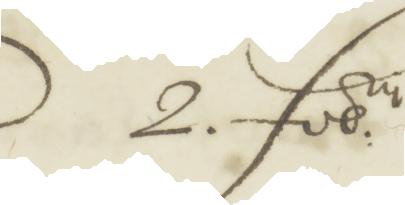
2. feb:ri
